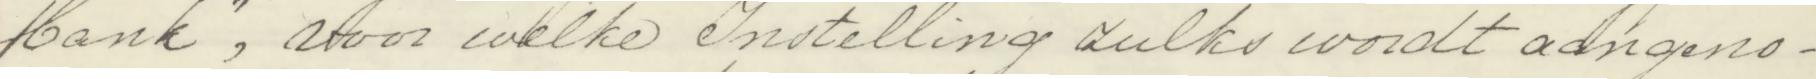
bank", voor welke Instelling zulks wordt aangeno-
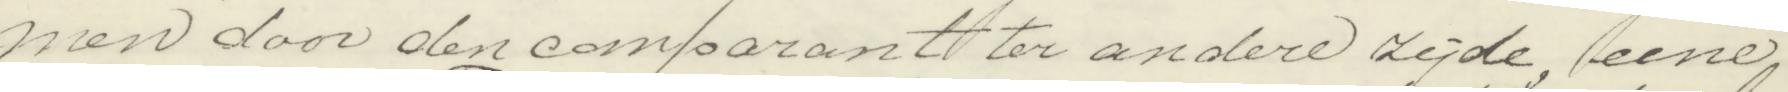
men door den comparant ter andere zijde, eene
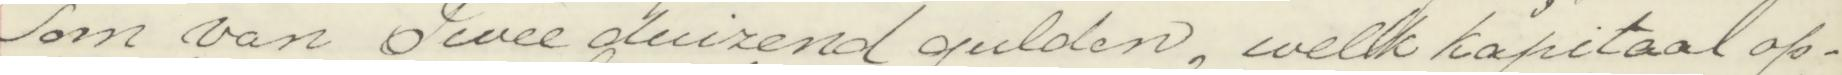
Som van Twee duizend gulden, welk kapitaal op-
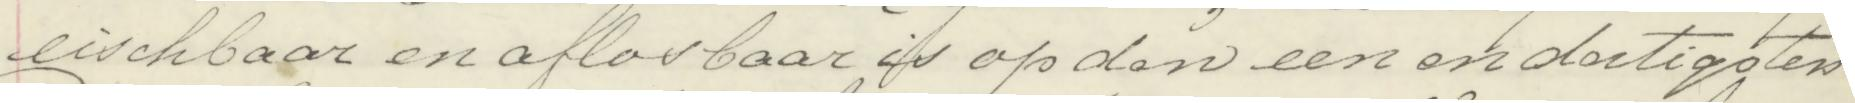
eischbaar en aflosbaar is op den een en dertigsten
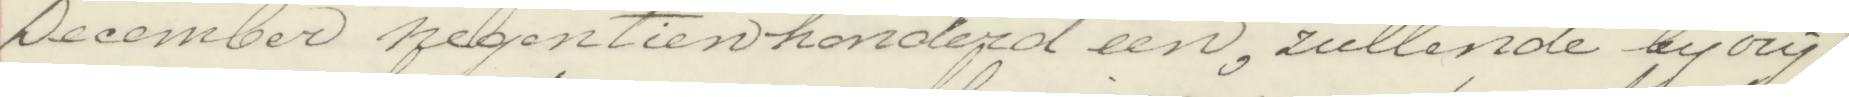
December negentien honderd een, zullende bij vrij-
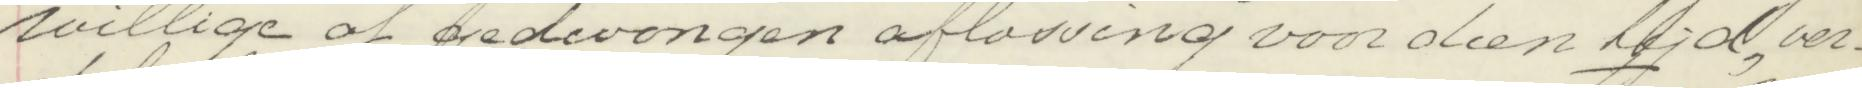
willige of gedwongen aflossing voor dien tijd, ver
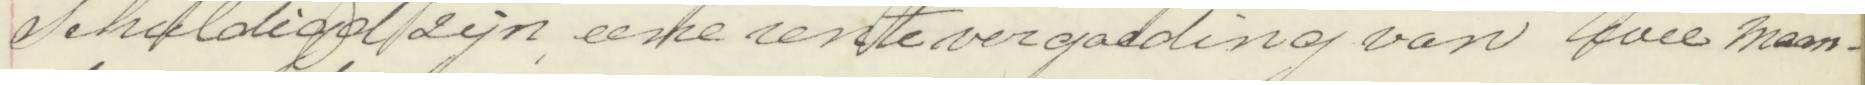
schuldigd zijn, eene rente vergoeding van twee maan-
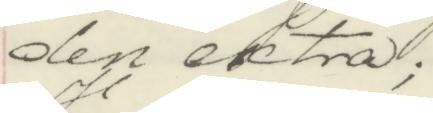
den extra;
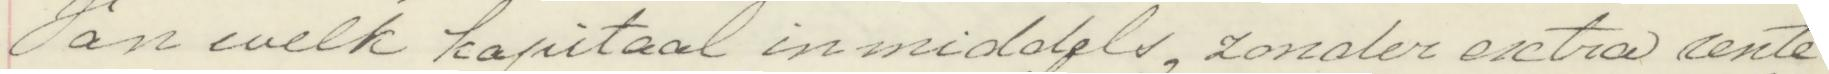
Van welk kapitaal inmiddels, zonder extra rente
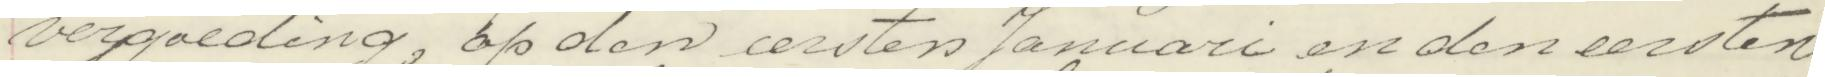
vergoeding, op den eersten januari en den eersten
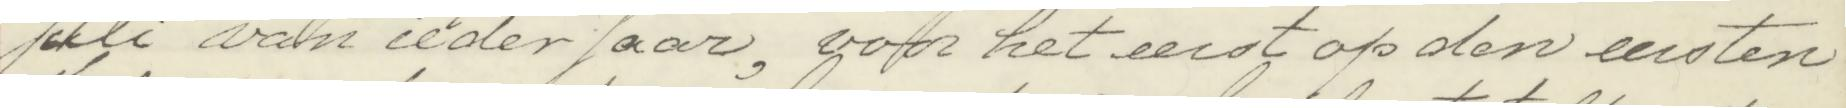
Juli van ieder jaar, voor het eerst op den eersten
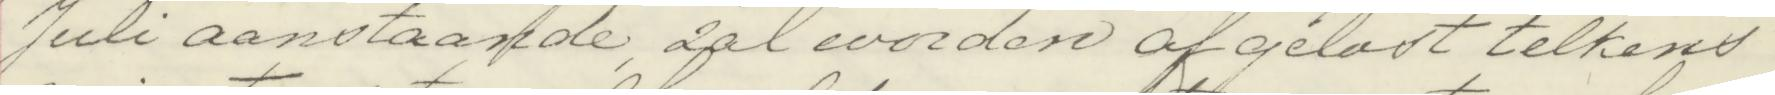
Juli aanstaande, zal worden afgelast telkens
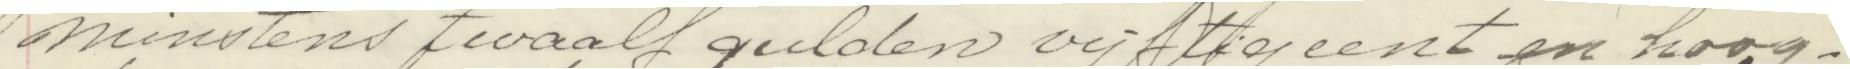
minstens twaalf gulden vijftig cent en hoog-
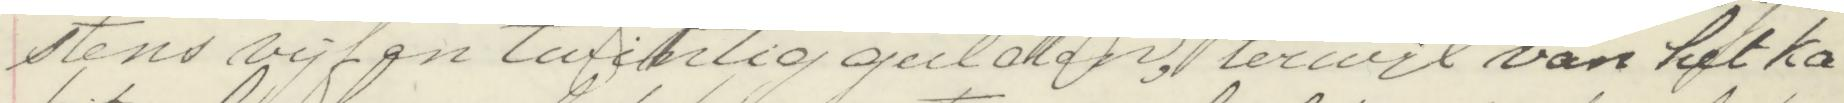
stens vijf en twintig gulden, terwijl van het ka
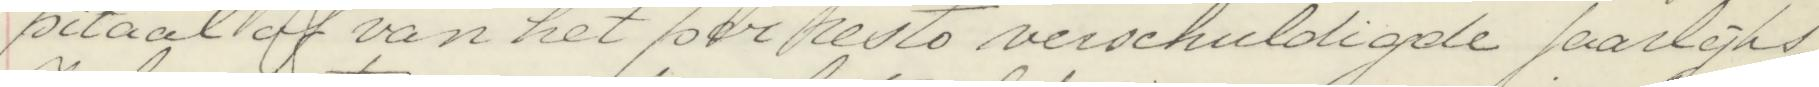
pitaal of van het per resto verschuldigde jaarlijks
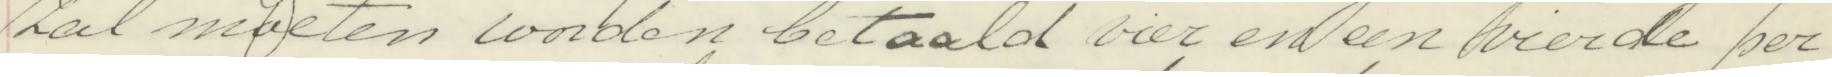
zal moeten worden betaald vier en een vierde per
